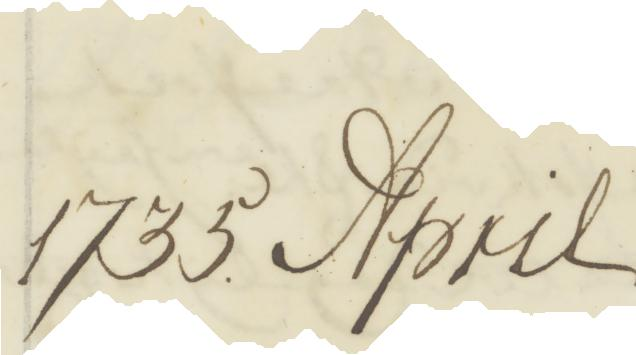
1735. April.
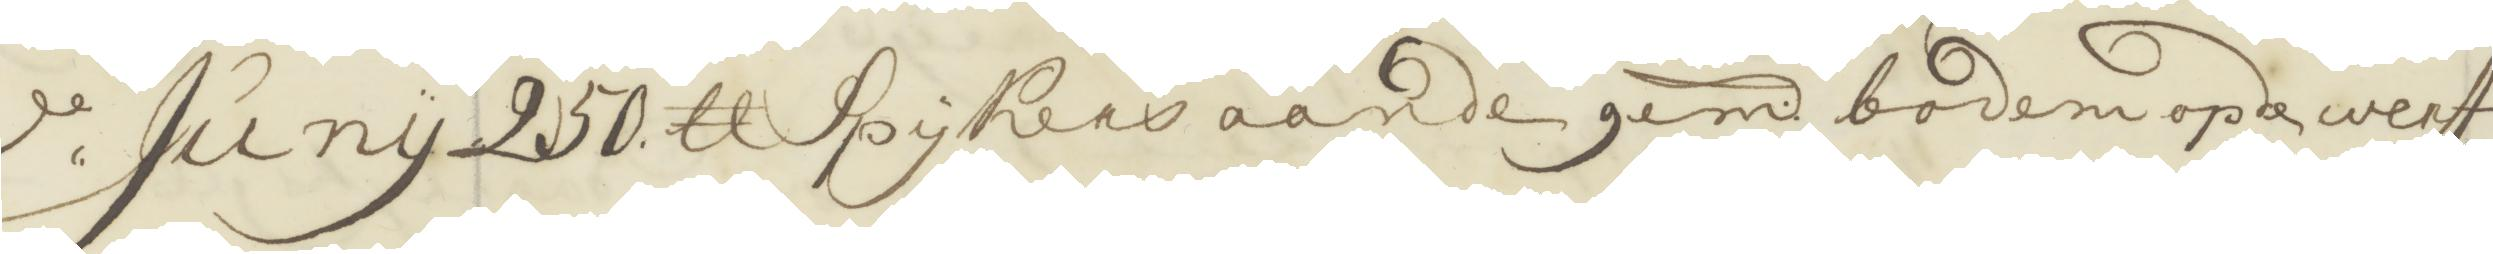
_„o Junij. 250. lb spijkers aande gem: bodem op de werff
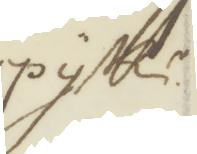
verspijk.'
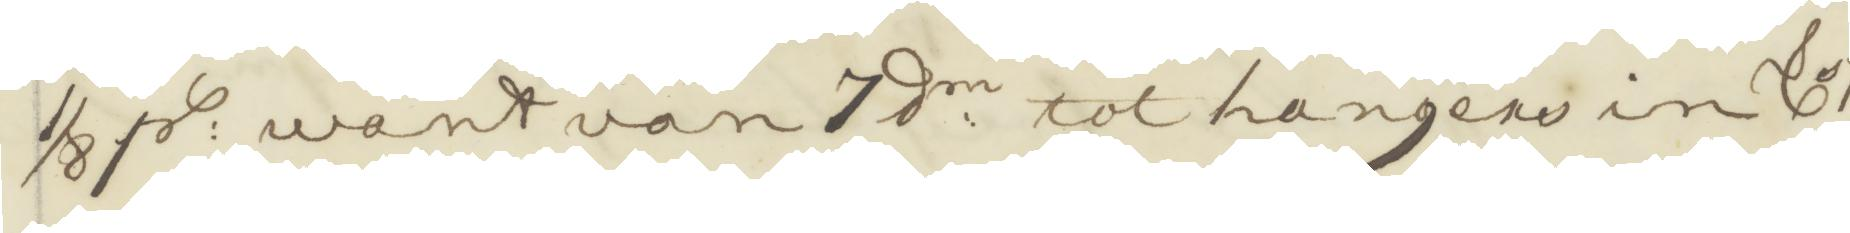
1/8 p:s want van 7d:m tot hangers in
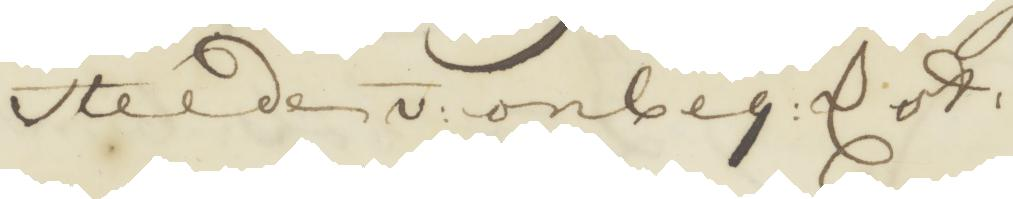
steede v. onbeq verst:
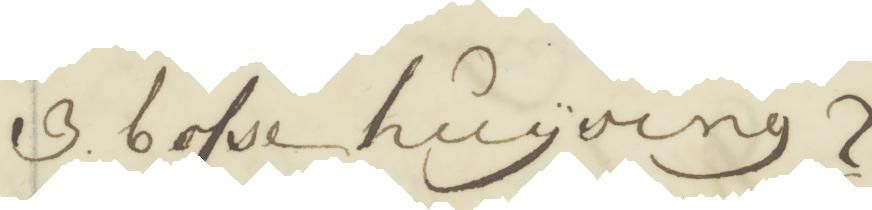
3. bosse huijsing }
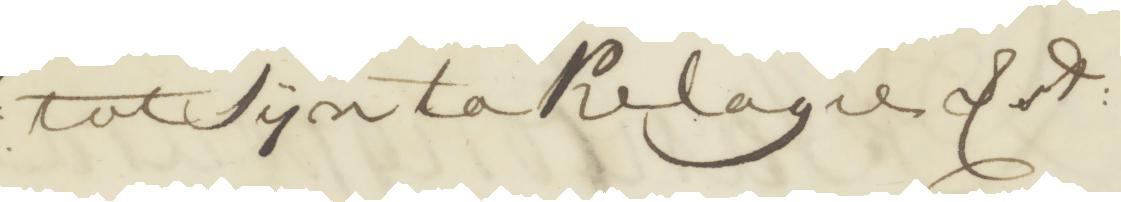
tot sijn takelagie verst:
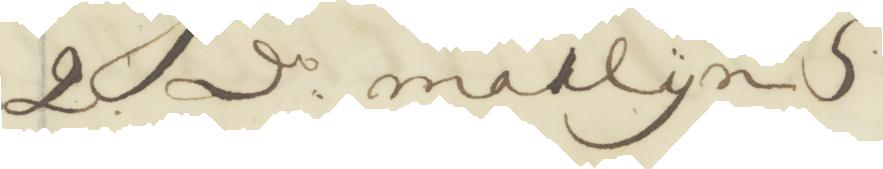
2 d:o marlijn }
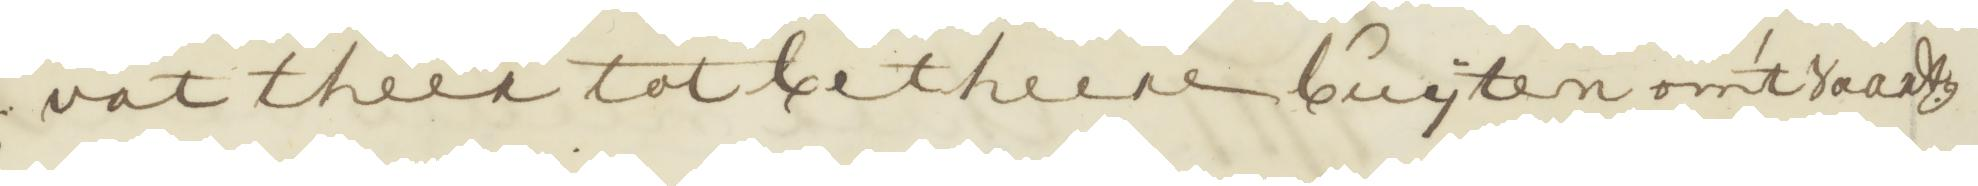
vat theer tot betheere buijten om’t vaart.g
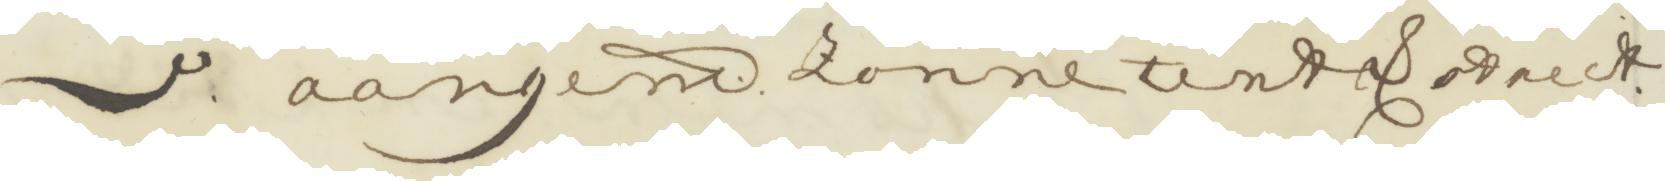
D.o aangem: zonne ten v verstrect
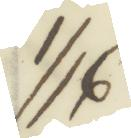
1/16
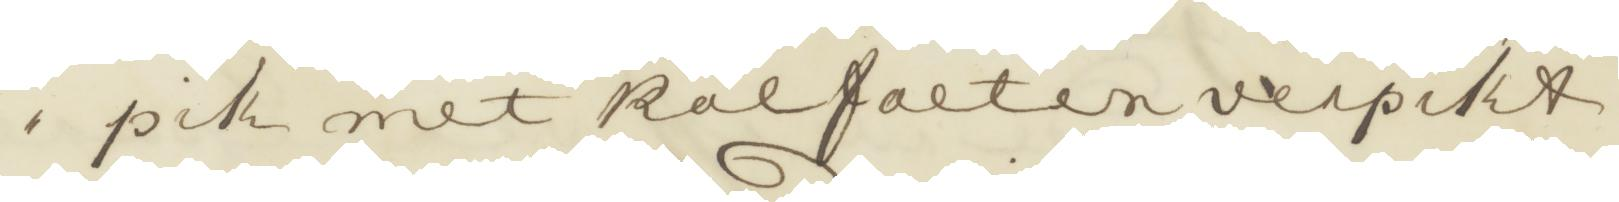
„ pik met kalfaeten verpikt
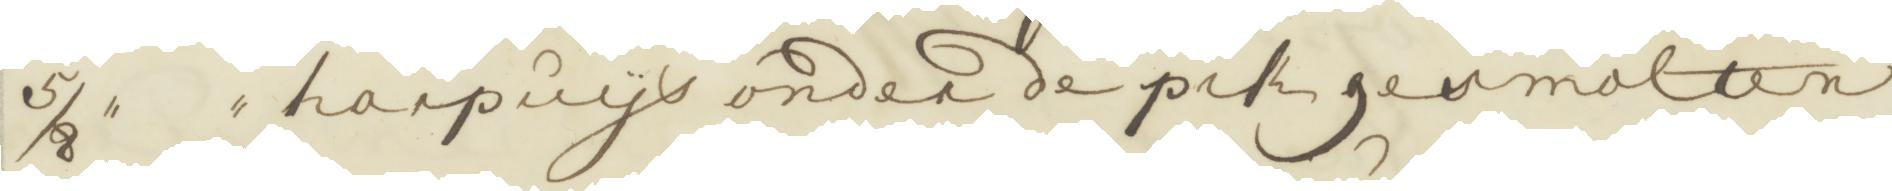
5/8„ „harpuijs onder de pik gesmolten
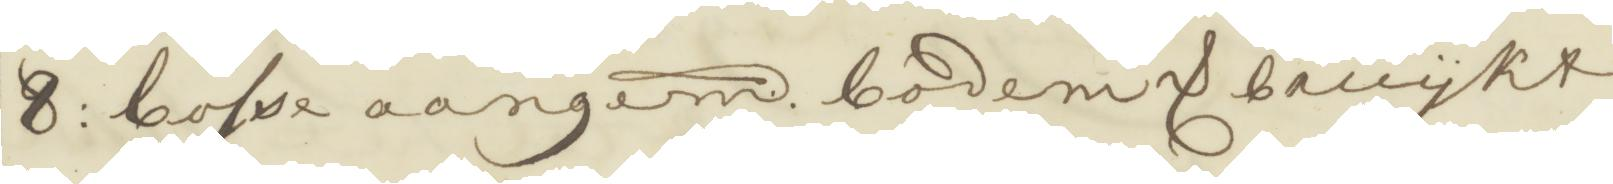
8: bosse aangem: bodem verbruijkt
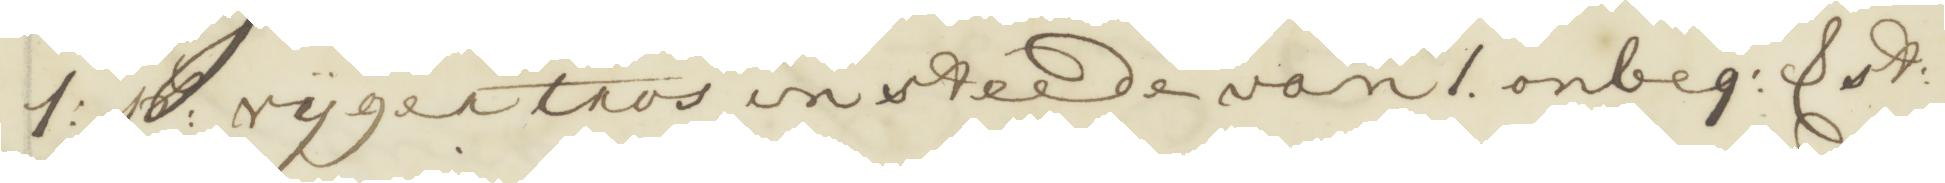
1: p:s vijgentros in steede van 1 onbeq: verst:
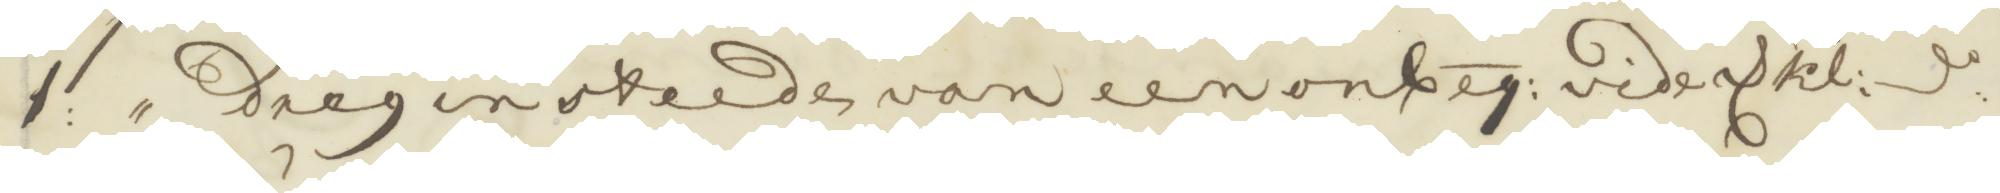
1: „ dreg in steede van een onbeq: vide verkl:_o
